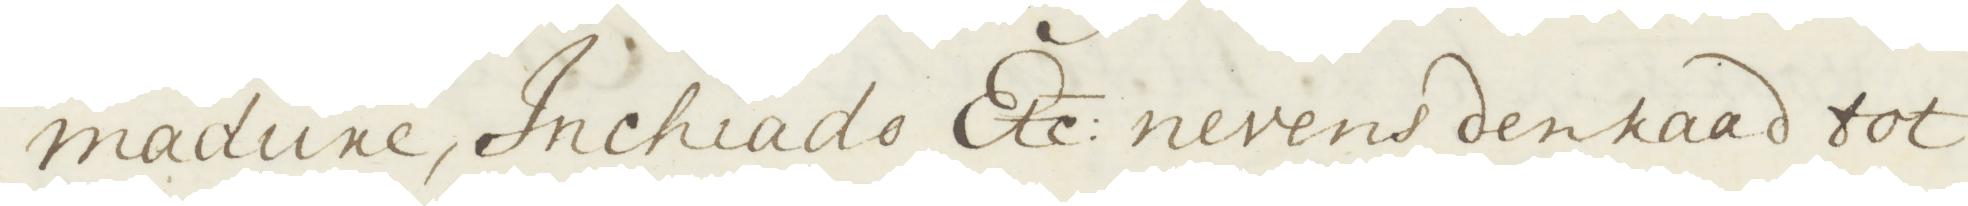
madure, Inchiado Etc: nevens den raad tot
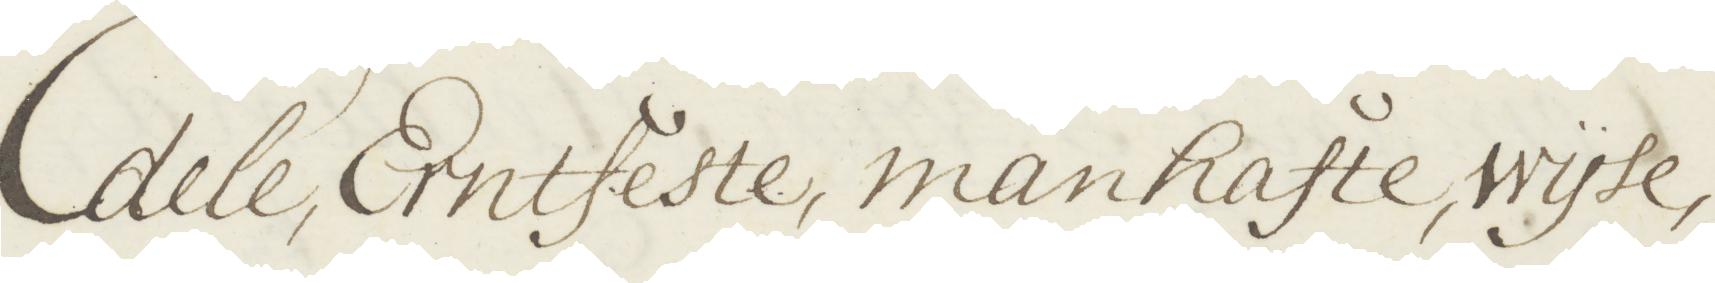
Edele, Erntfeste, manhafte, wijse,
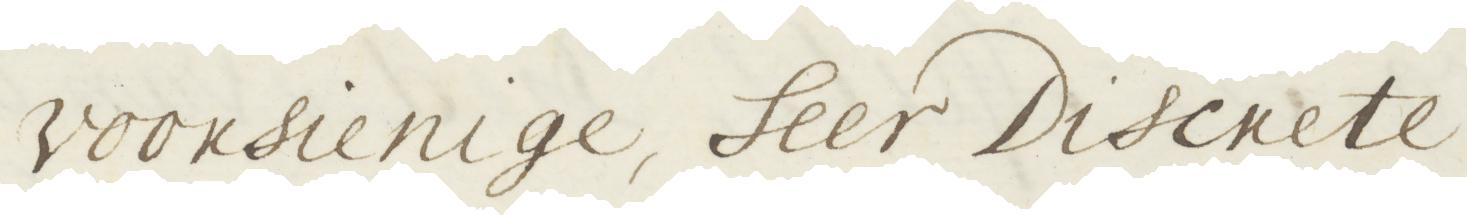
voorsienige, seer Discrete
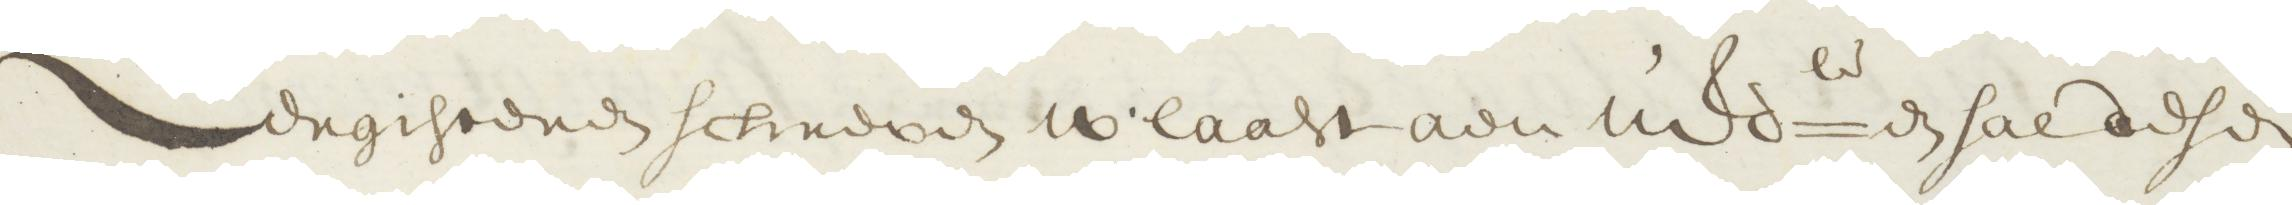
Eergisteren schreven w'laast aen uEd=le en sal desen
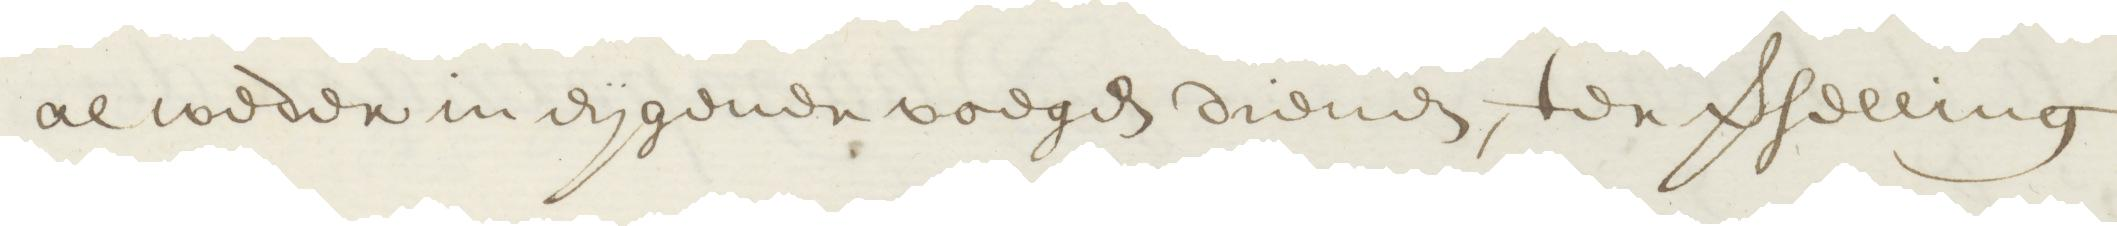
al weder in eijgener voegen dienen, ter verselling
